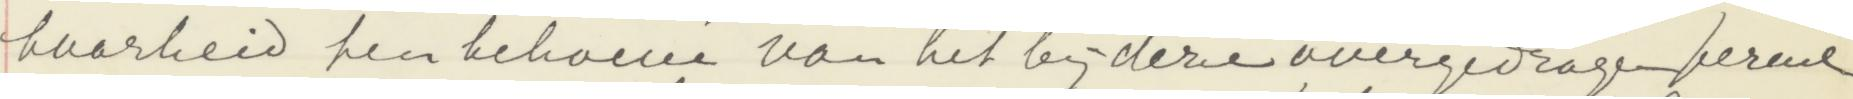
baarheid ten behoeve van het bij deze overgedragen perceel
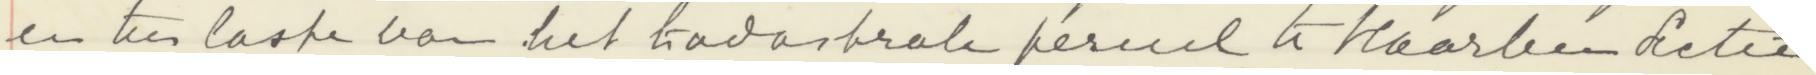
en ten laste van het kadastrale perceel te Haarlem Sectie
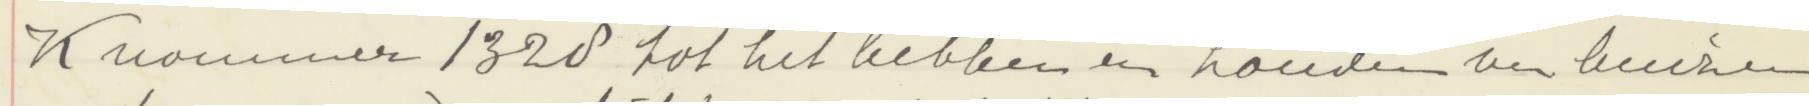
K nommer 1328 tot het hebben en houden ven buizen
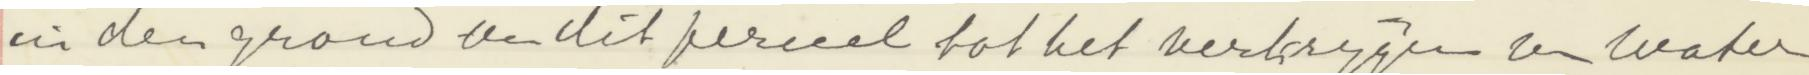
in den grond van dit perceel tot het verkrijgen van water
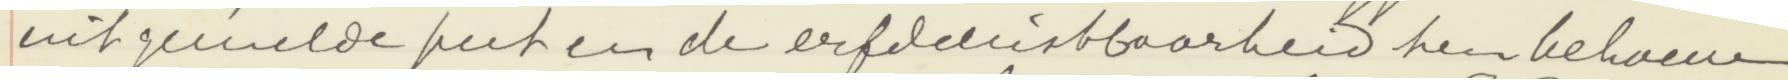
uit gemelde put en de erfdienstbaarheid ten behoeve
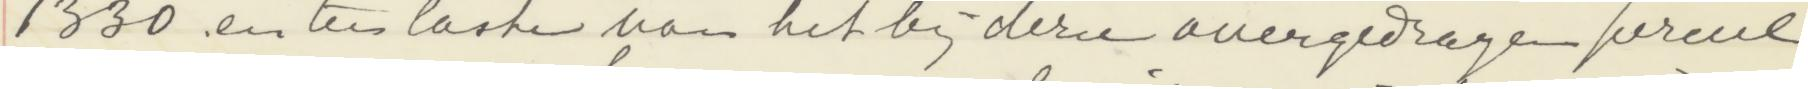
1330, en ten laste van het bij deze overgedragen perceel
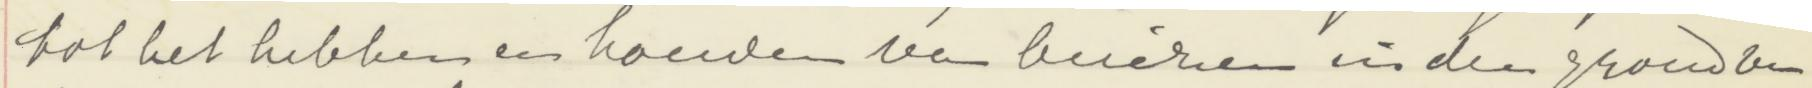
tot het hebben en houden van buizen in den grond van
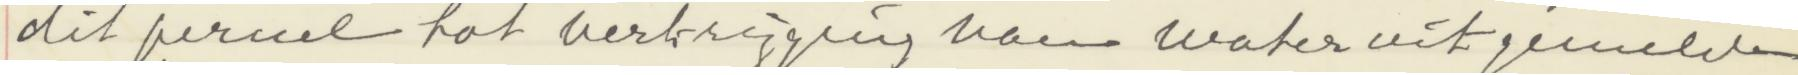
dit perceel tot verkrijging van water uit gemelde
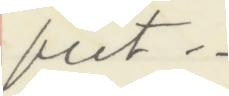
put.
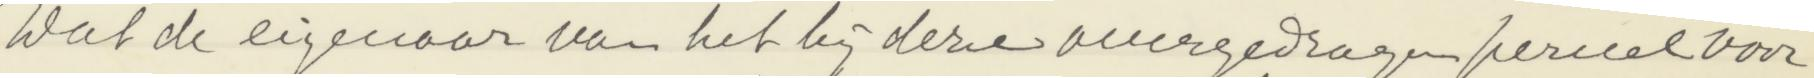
Dat de eigenaar van het bij deze overgedragen perceel voor
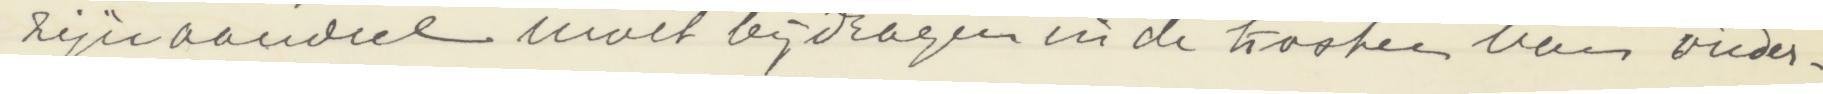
zijn aandeel moet bijdragen in de kosten van onder-
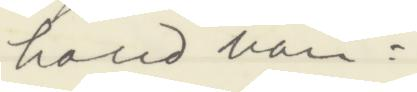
houd van:
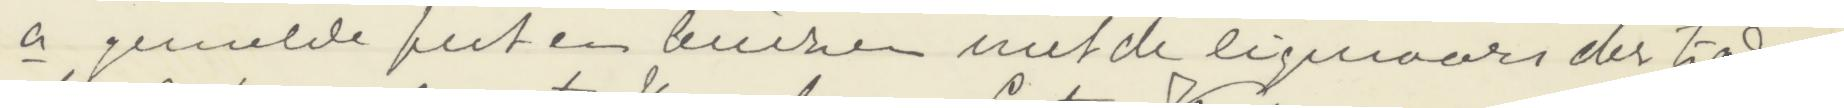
a gemelde put en buizen met de eigenaars der kada-
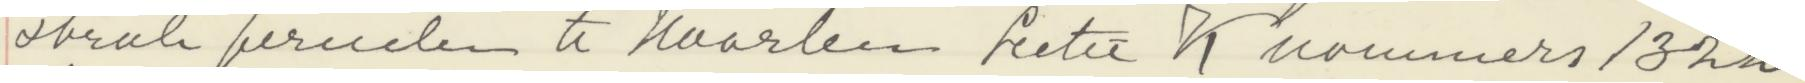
strale perceelen te Haarlem Sectie K nommers 1322
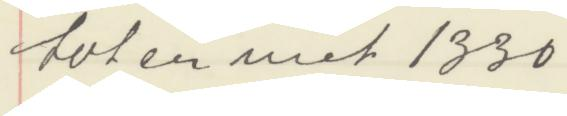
tot en met 1330
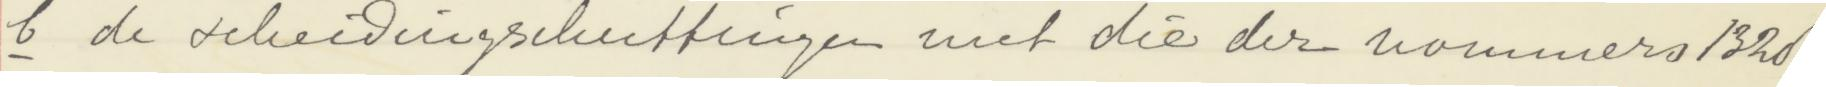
b de scheidingschuttingen met die der nommers 1328
